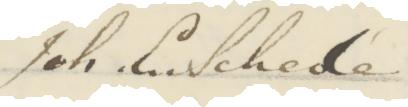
Joh. Enschedé
